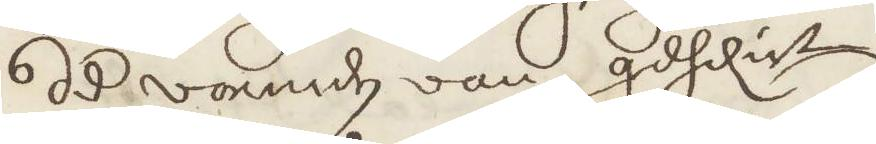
de vormen van geschut
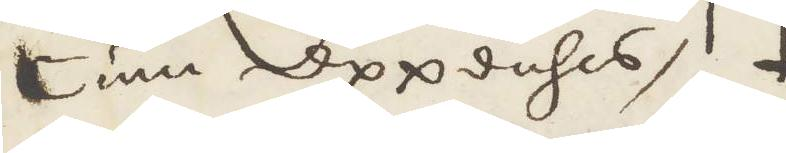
Cum expensis/
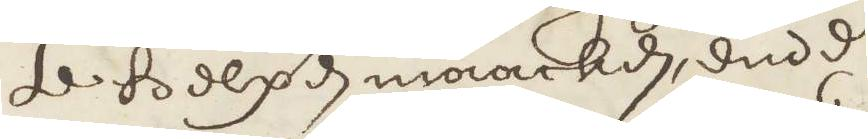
te helpen maacken, ende
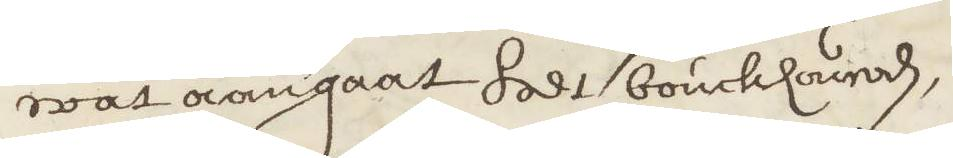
wat aangaat het bouckhouwen,
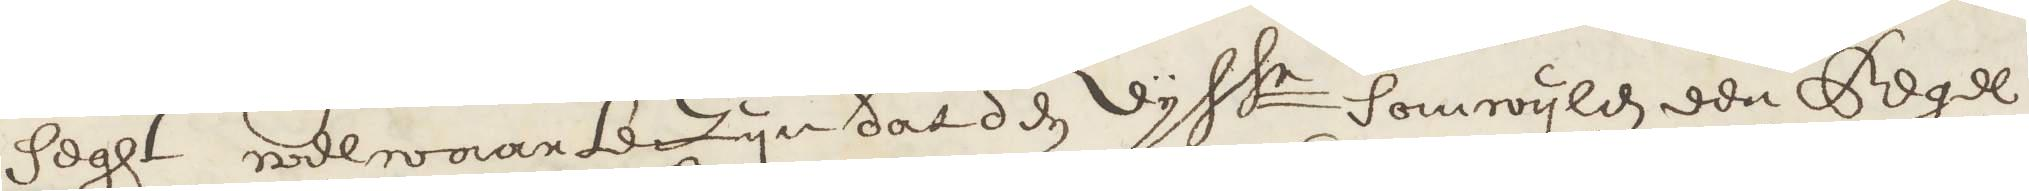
seght welwaar te zijn dat den eijss=r somwijlen een Regel
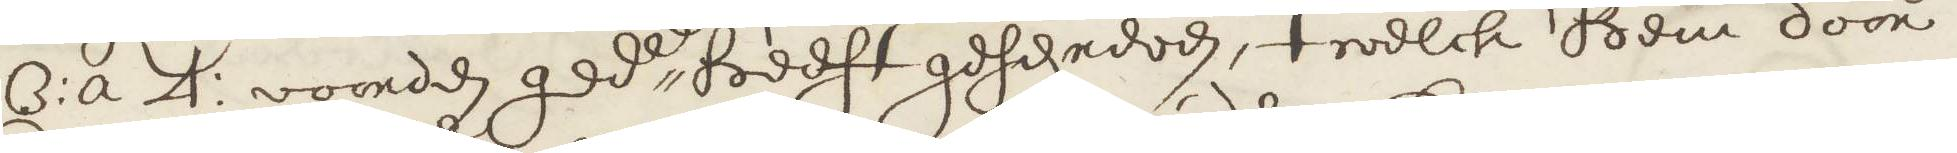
3: a 4: voorden ged„e heeft geschreven, t welck hem door
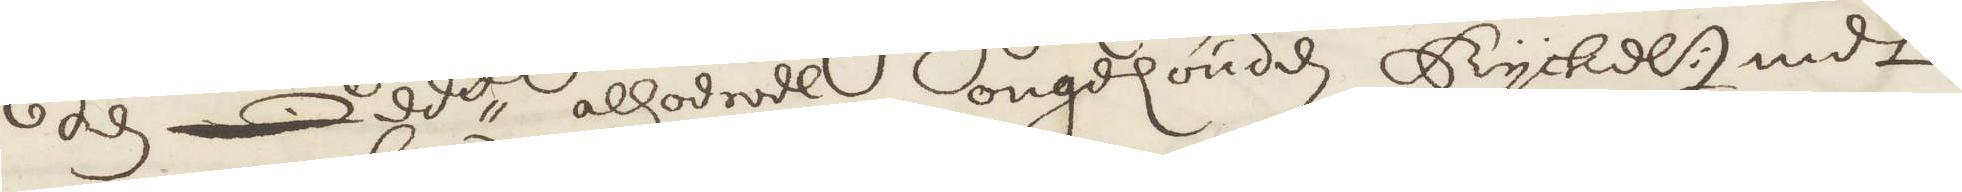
den Ged„e alhoewel ongehouden Rijckelijk met
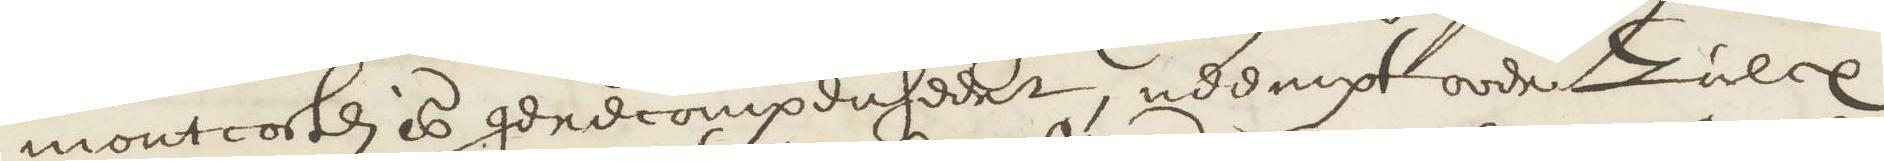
montcosten is gerecompenseert, neempt over zulcx
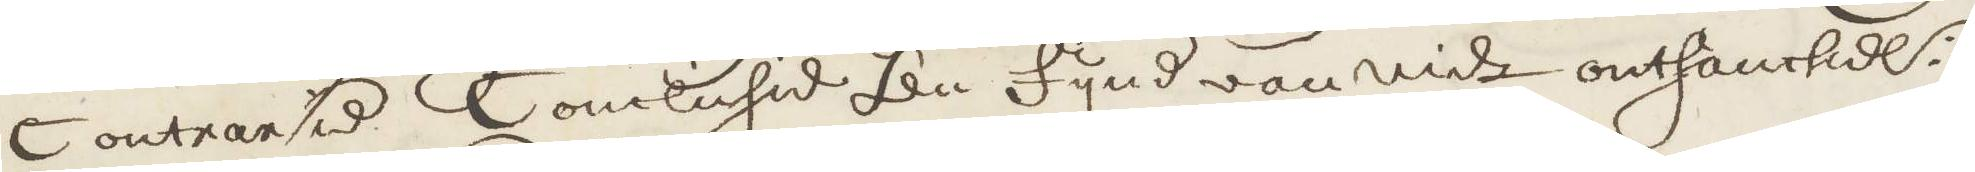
Contrarie Conclusie ten Fijne van niet ontfanckelijk,
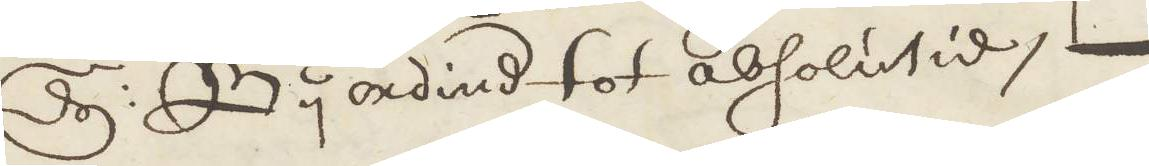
ende Bij ordine tot absolutie,
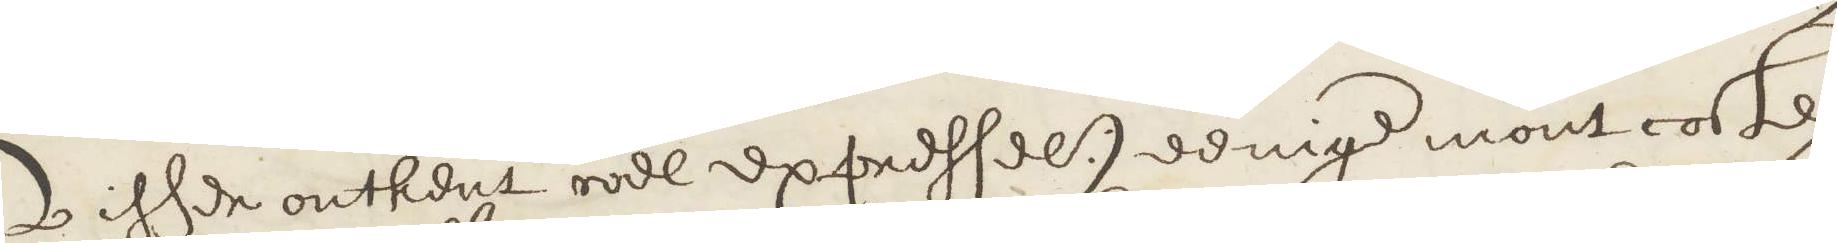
Visser ontkent wel expresselijk eenige mont costen
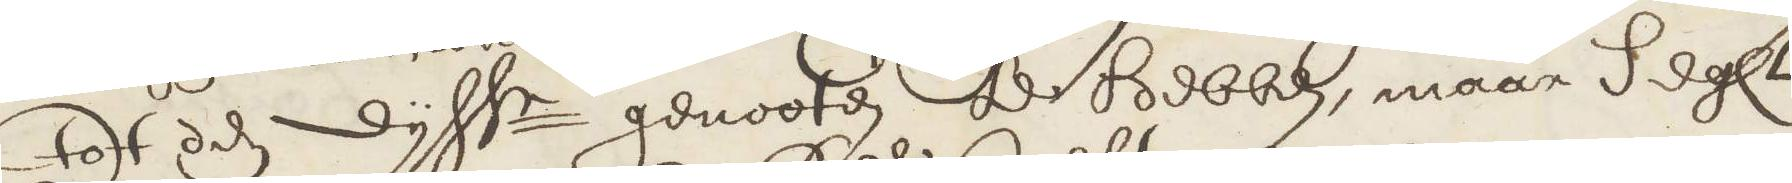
tot den eijss=r genooten te hebben, maar seght
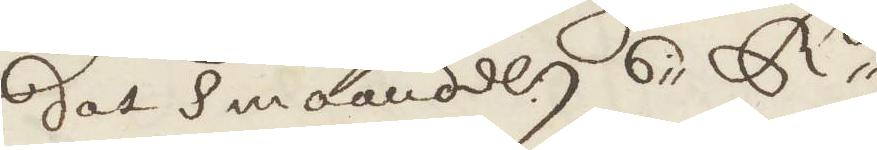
dat smaandelijk 6„ R„al heeft verteert, ende
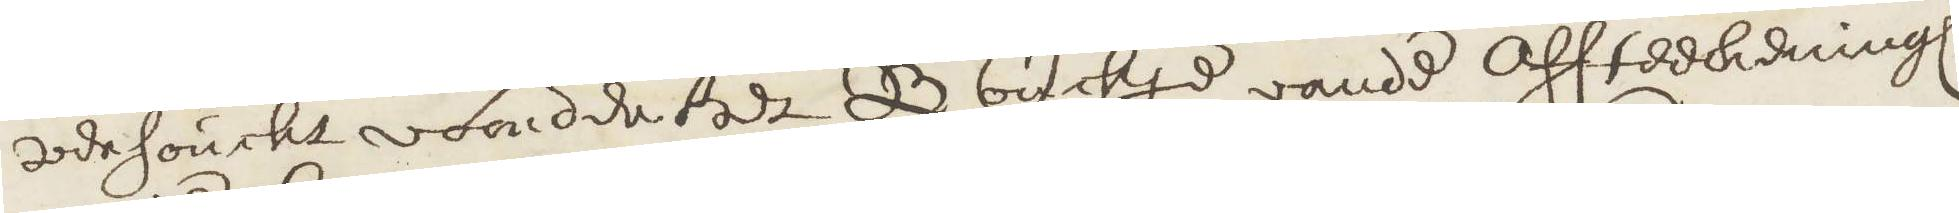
versouckt voor der het Bouckje vande affteeckeningh
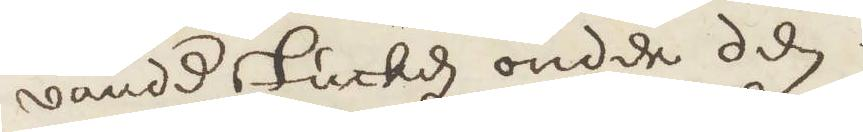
vande stucken onder den Ged„e berustende, maar
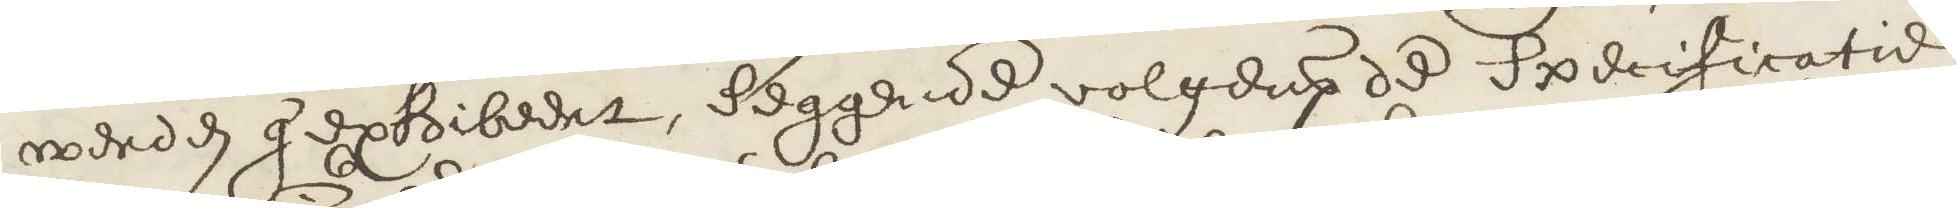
werden g’exhibeert, seggende volgens de specificatie
